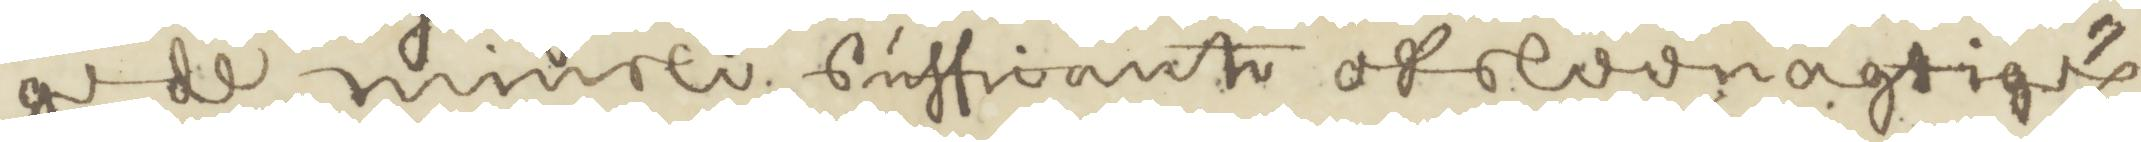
ge de minste sufficante of steenagtige
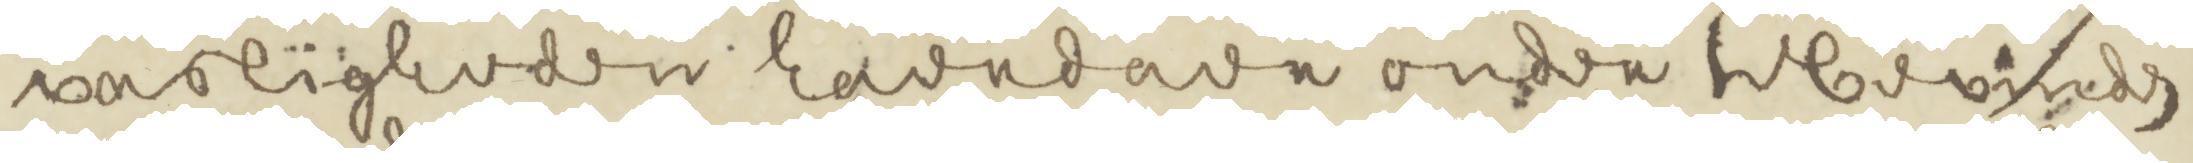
vastigheden haer daer onder te bevinden
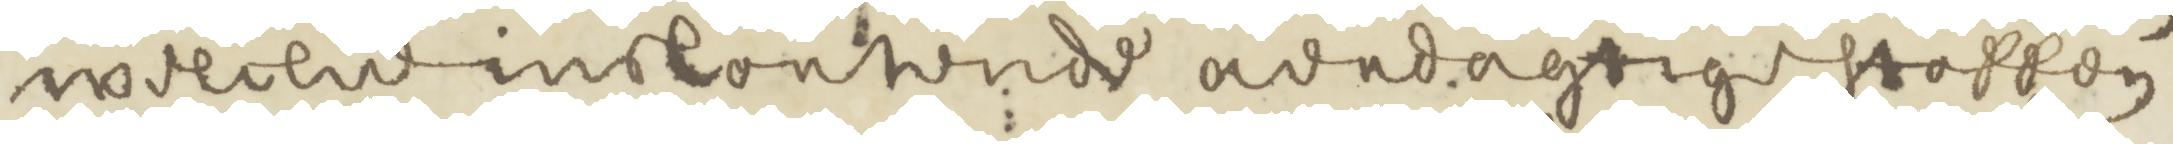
welcke instortende aerdagtige stoffen
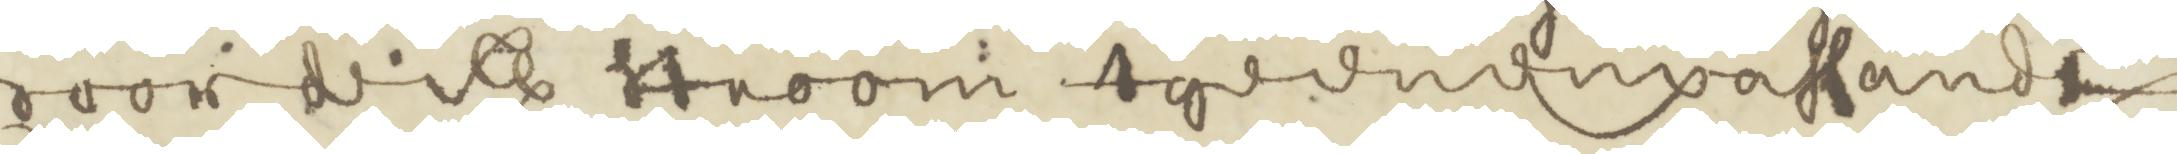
door de Ex stroom tgeen en passandt
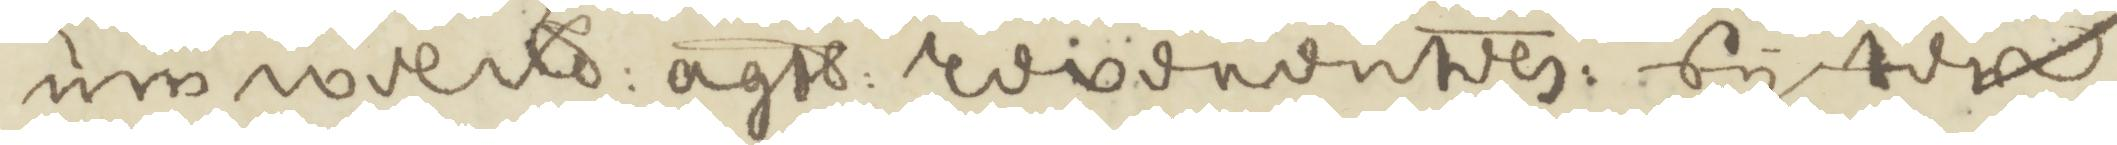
uw wel Ed: agtb: reverentelijk sij ter
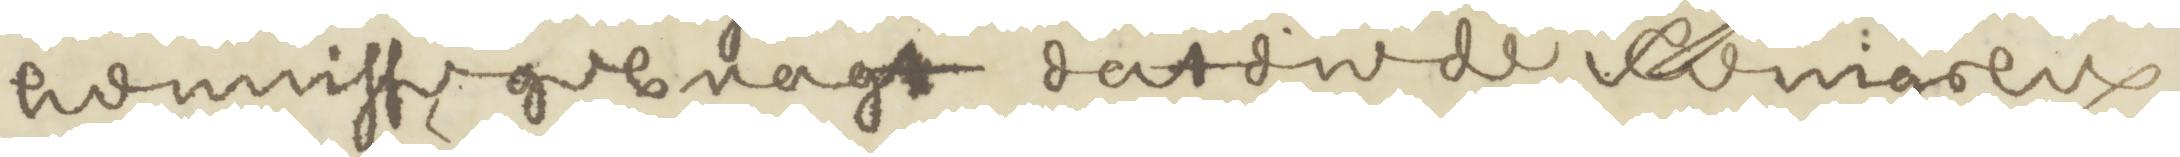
kennisse gebragt dat die de Eenigsten
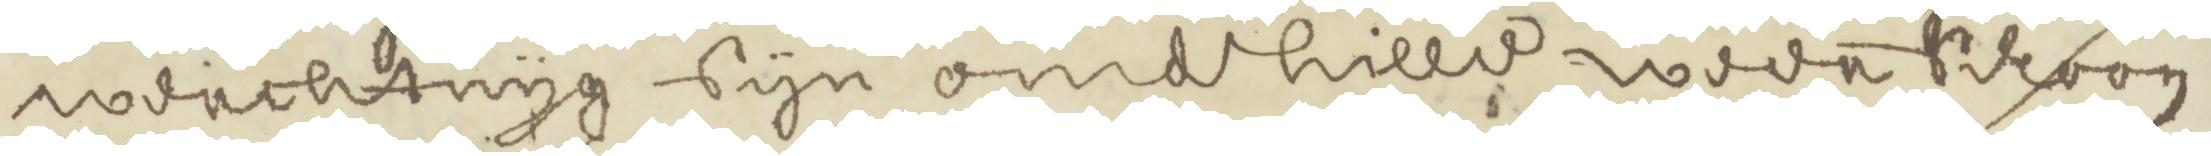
wercktuijg sijn om de kille weer schoon
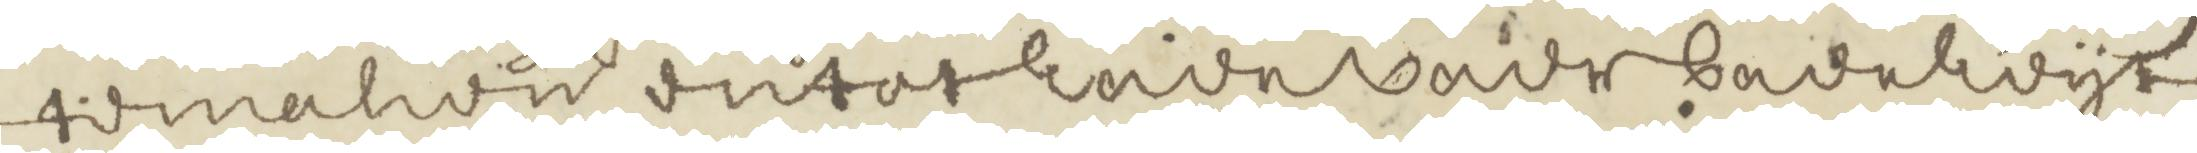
te maken en tot haer vaerbaerheijt
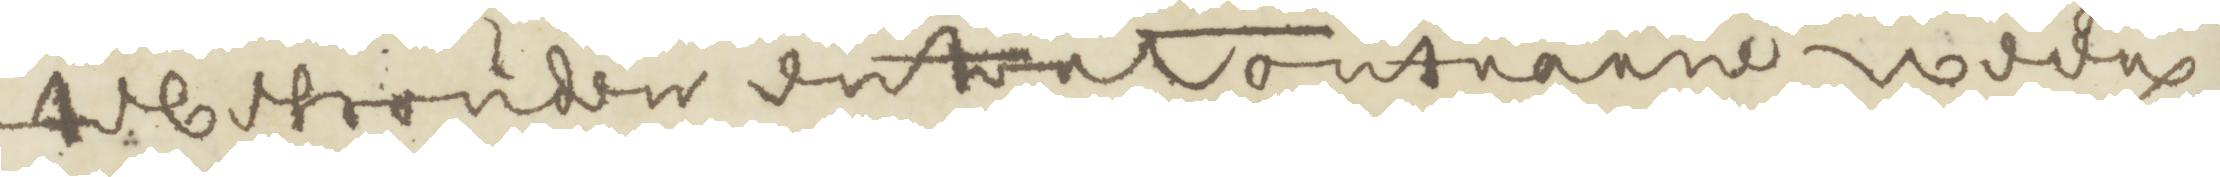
te behouden en ter Contrarie weer
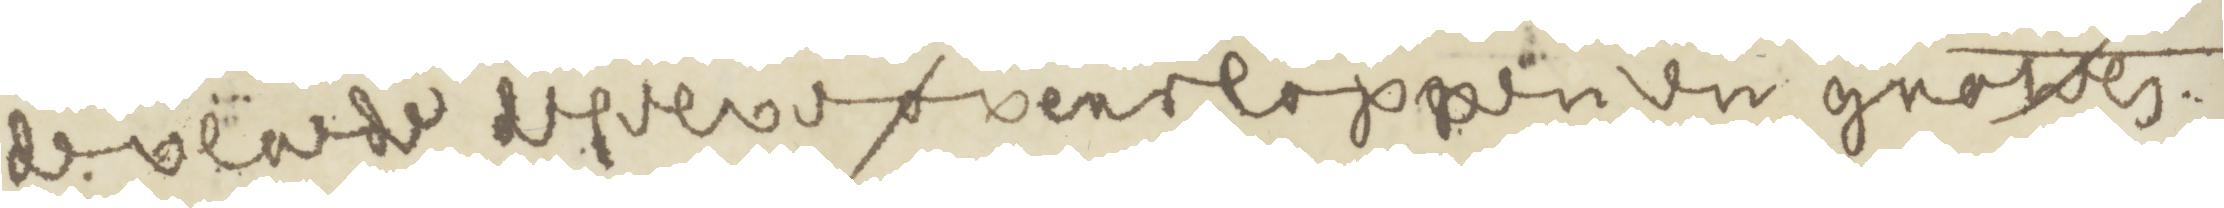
de vloede deselve oversloppen en grotelijk
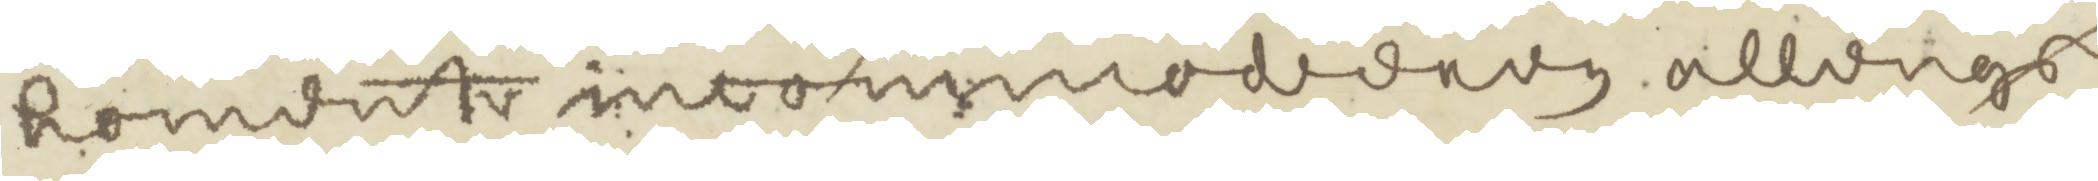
komen te incommodeeren allengs
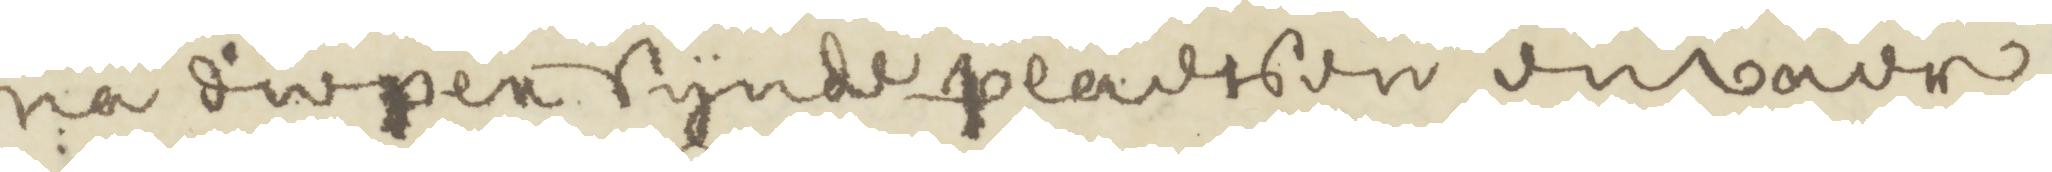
na dieper sijnde plaetsen en vaer
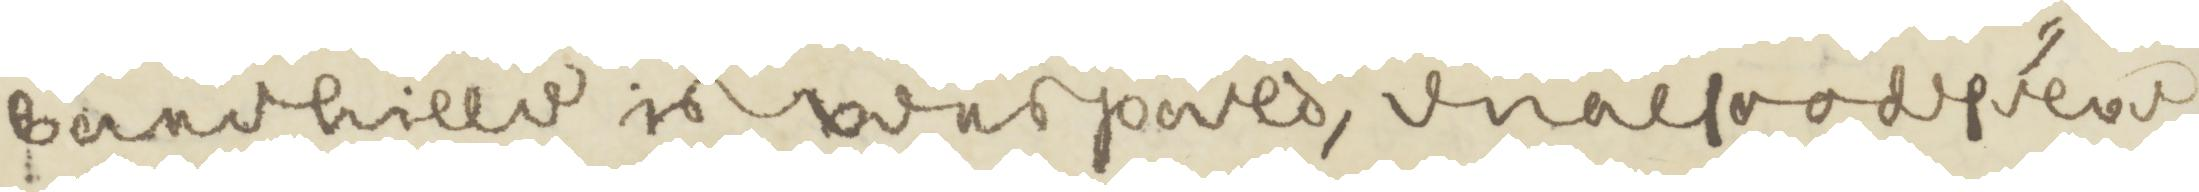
bare kille is verspoeld, en alsoo deselve
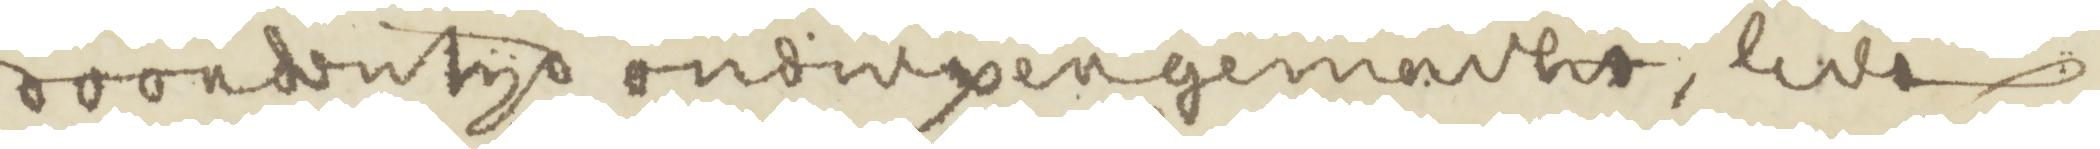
door den tijd ondieper gemaekt, het
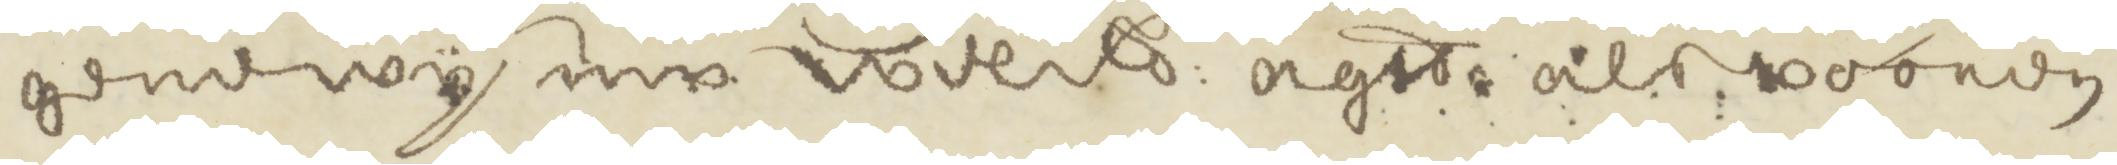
gene wij uw welEd: agtb„ als vooren
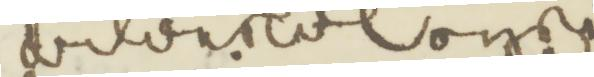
de Eerste Consi
